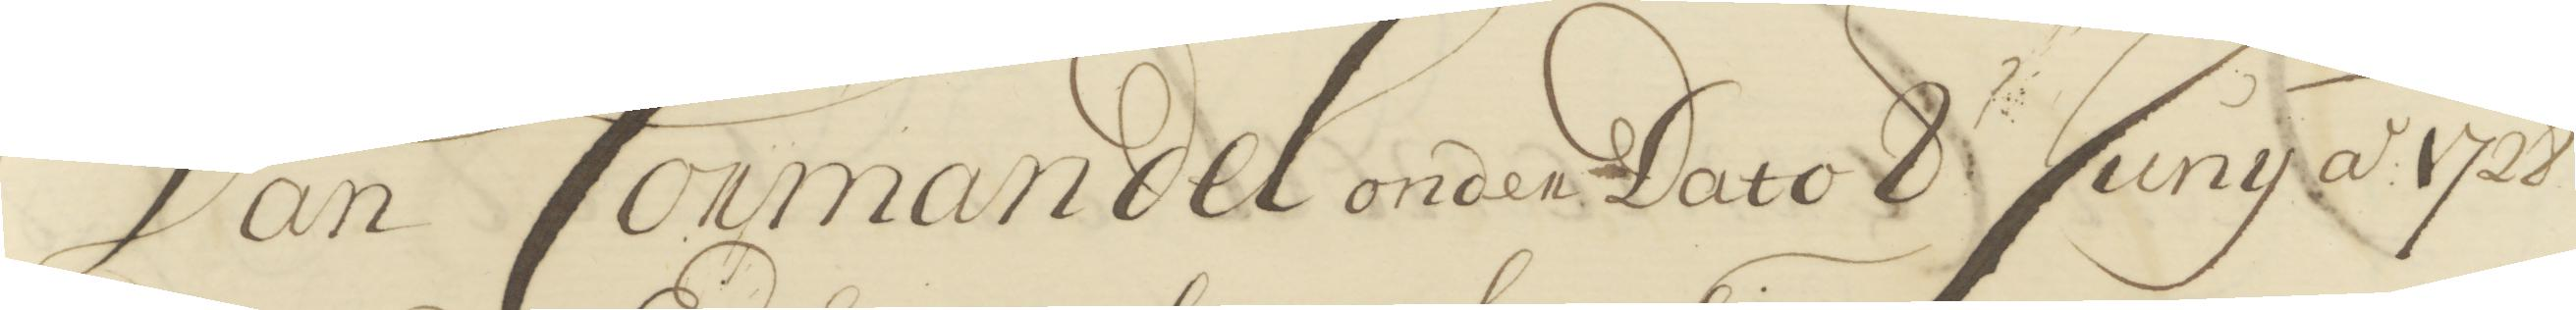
Van Cormandel onder Dato 8:' Juny a:' 1728
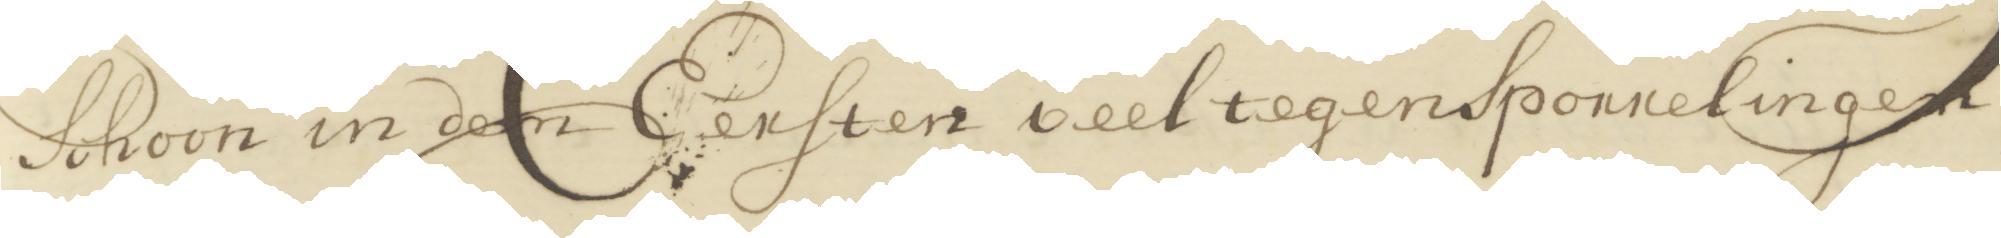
Schoon in den Eersten veel tegensporrelingen
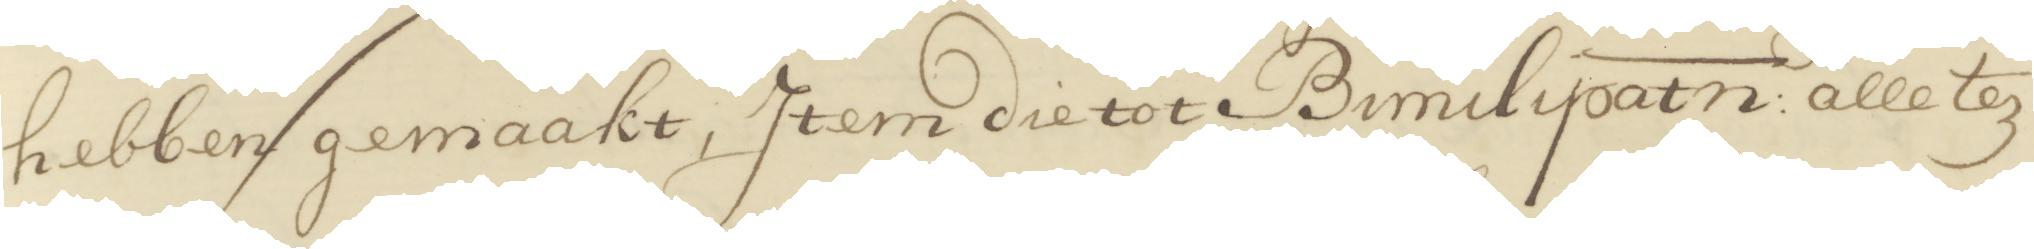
hebben gemaakt, Jtem die tot Bimilipatn: alle ten
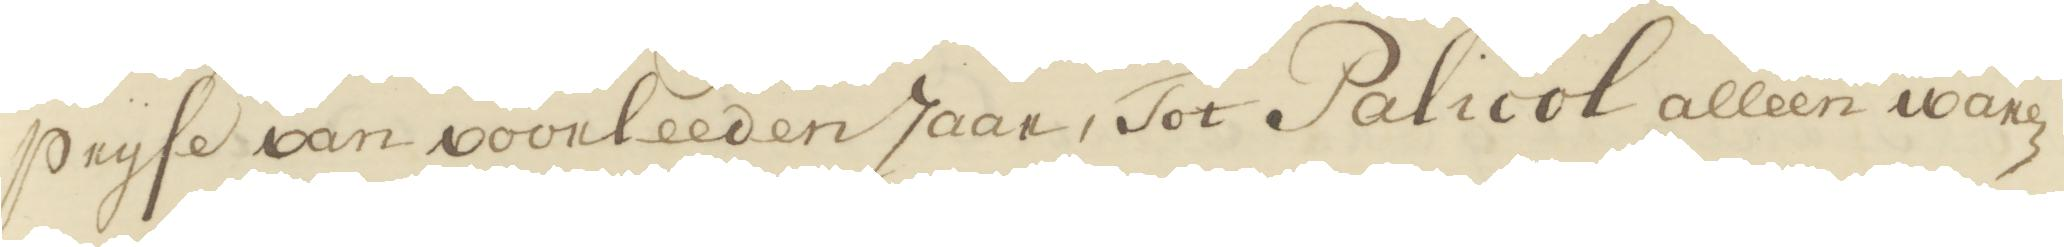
prijse van voorleeden Jaar, Tot Palicol alleen waren
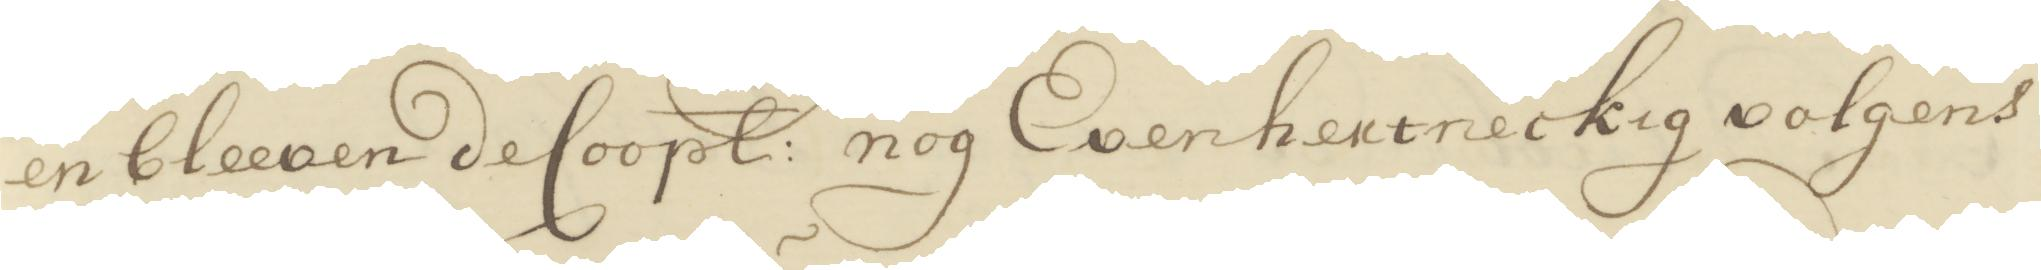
en bleeven de Coopl: nog Even hertneckig volgens
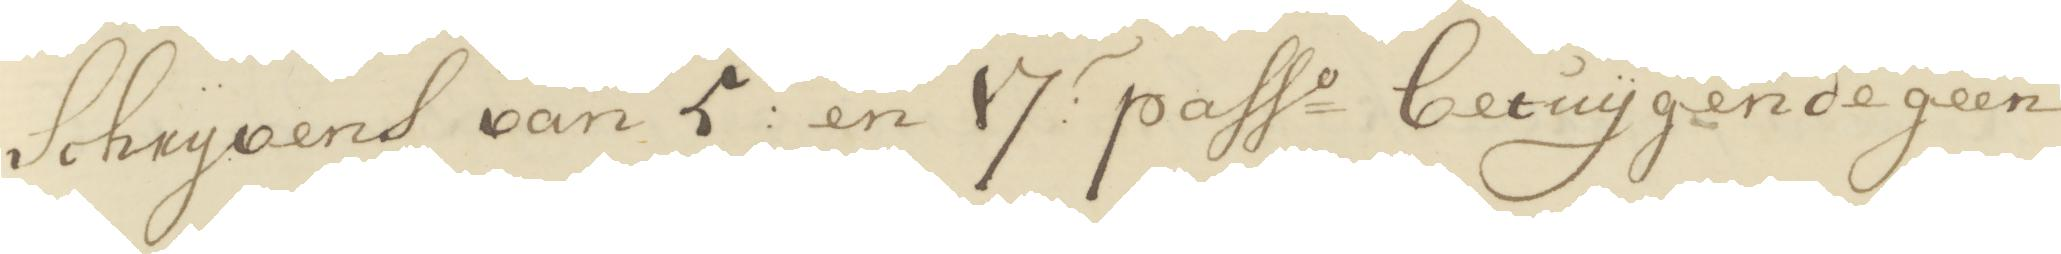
Schrijvens van 5:' en 17:' pass=o betuijgende geen
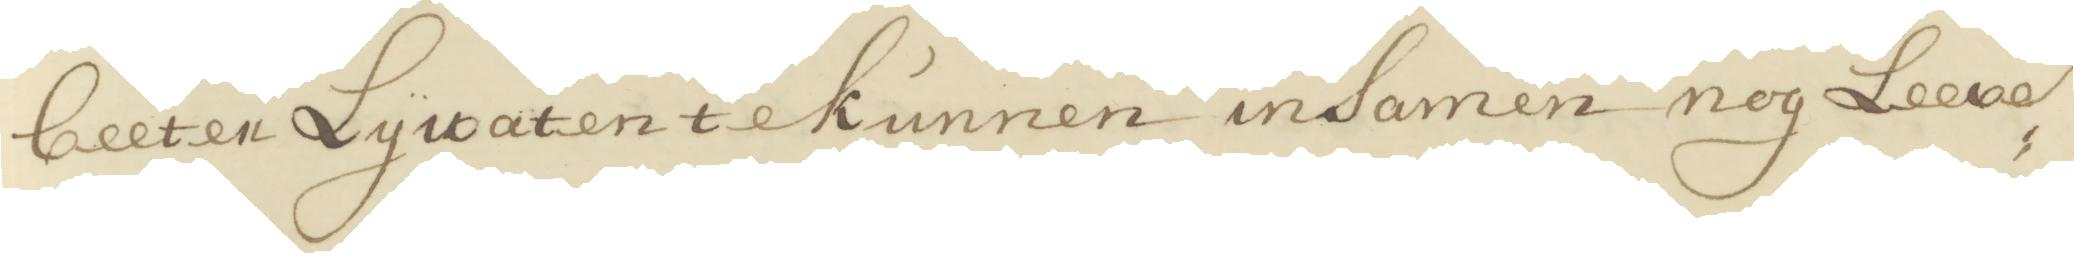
beeter Lijwaten te kunnen insamen nog Leeve„
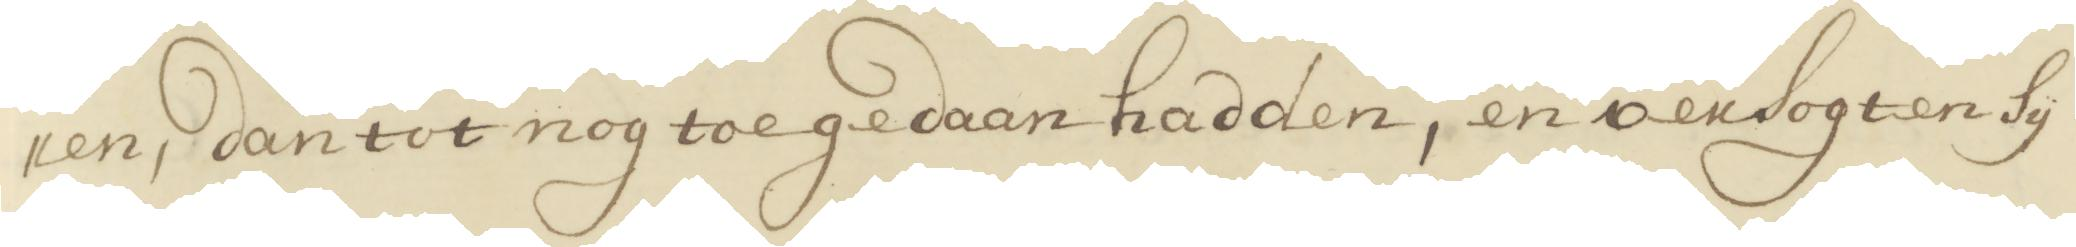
ren, dan tot nog toe gedaan hadden, en versogten Sij
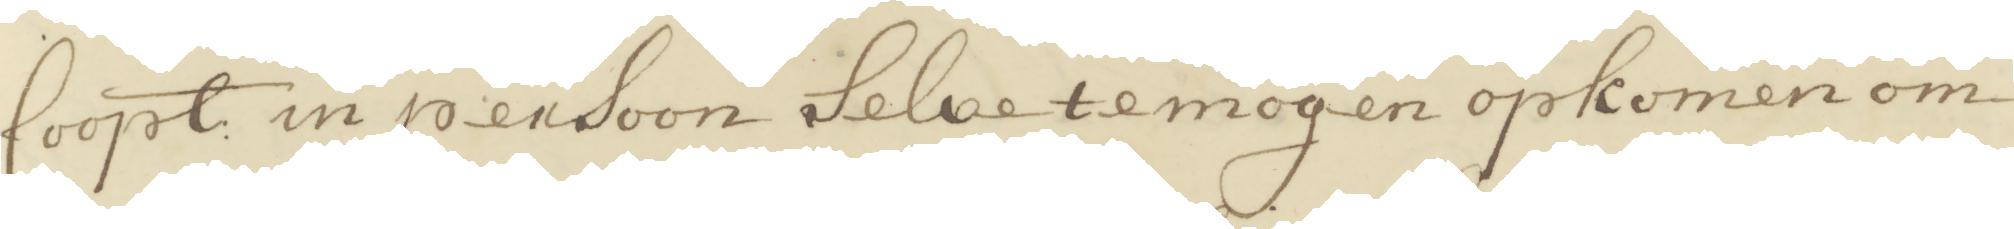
Coopl: in persoon selve te mogen op komen om
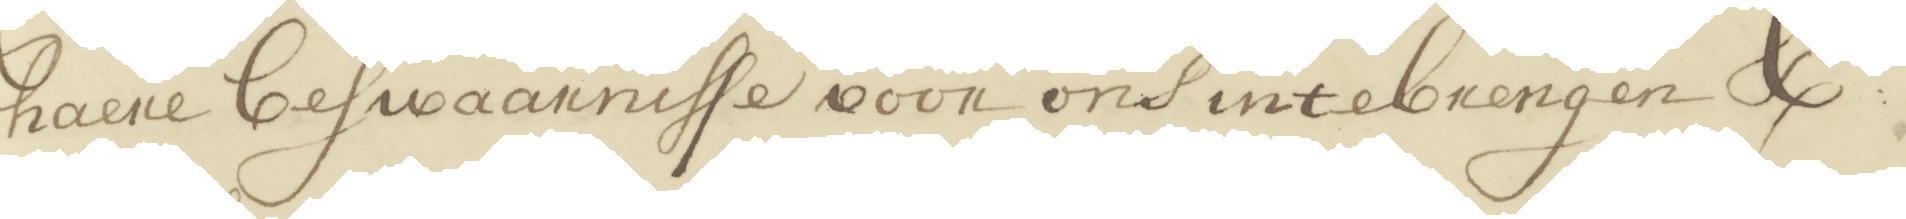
haere beswaarnisse voor ons in te brengen &:'a
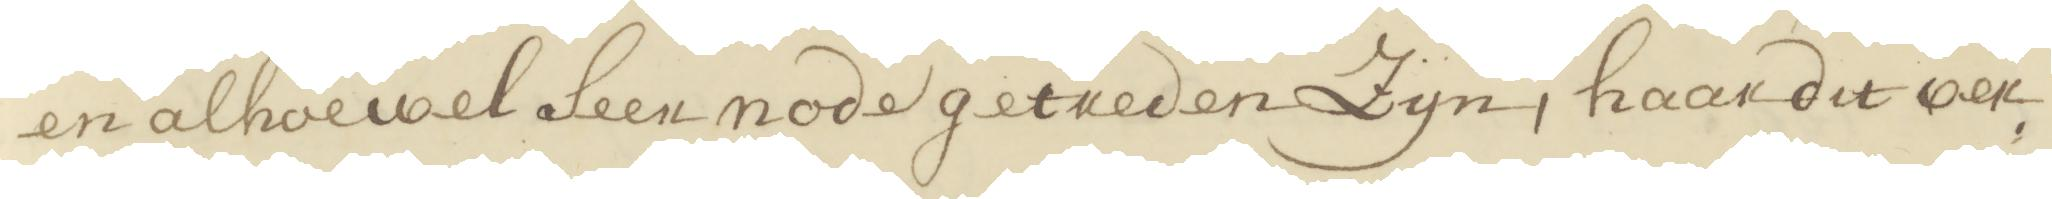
en alhoewel Seer node getreden Zijn, haar dit ver„
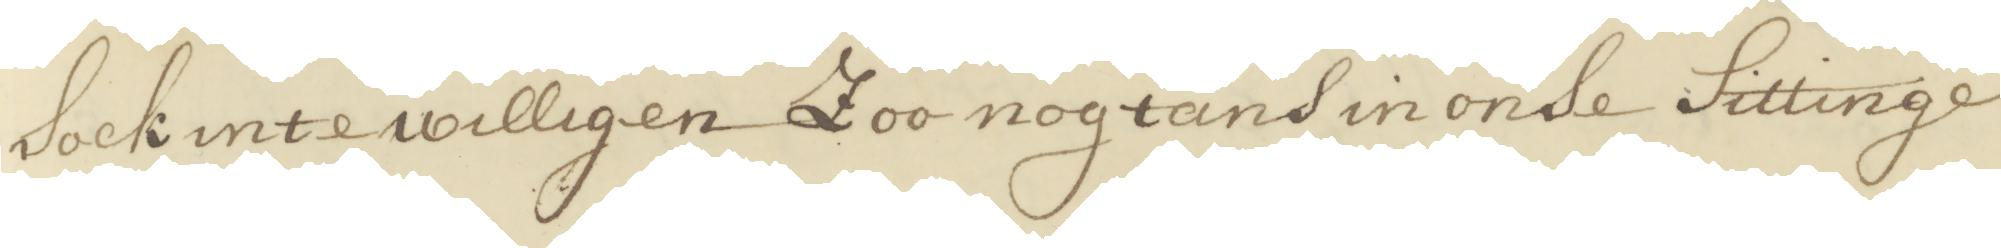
Soek in te willigen Zoo nogtans in onse Sittinge
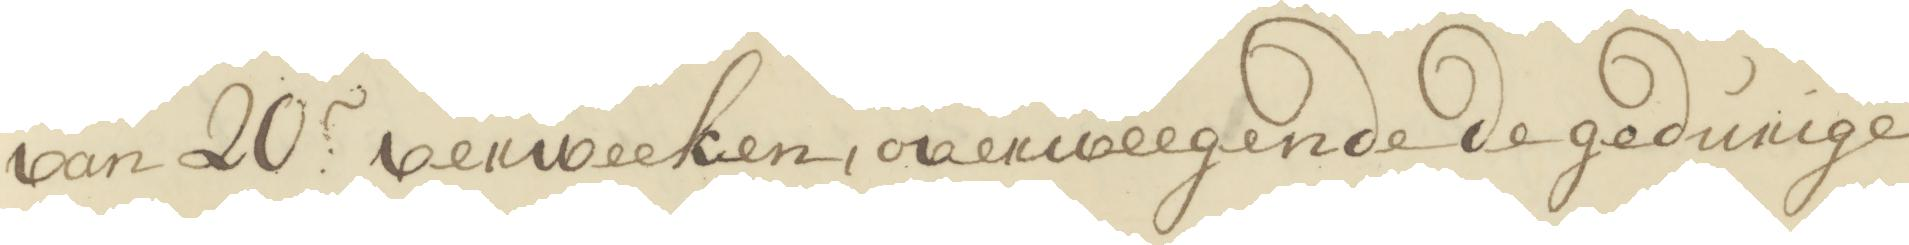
van 20:' verweeken, overweegende de gedurige
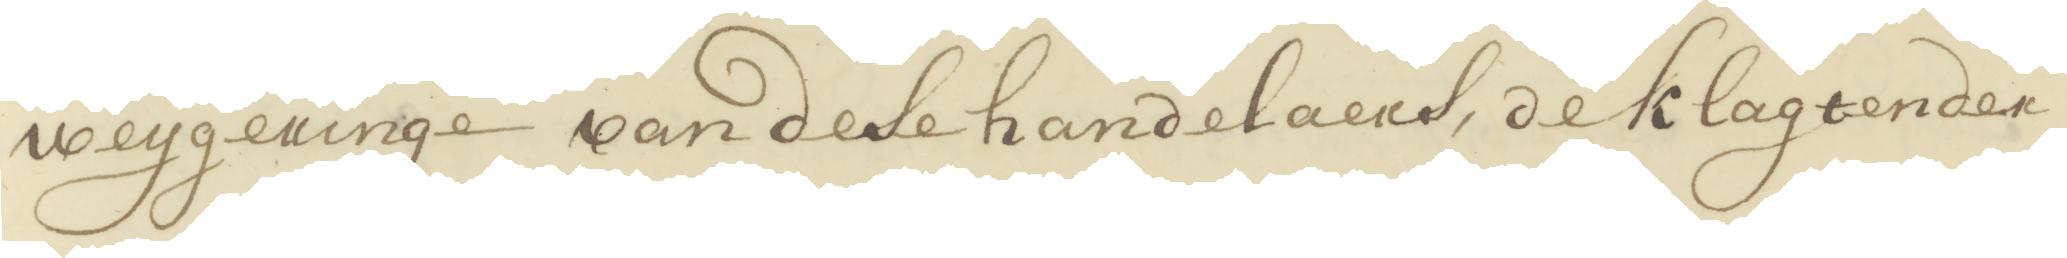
weijgeringe van dese handelaers, de klagten der
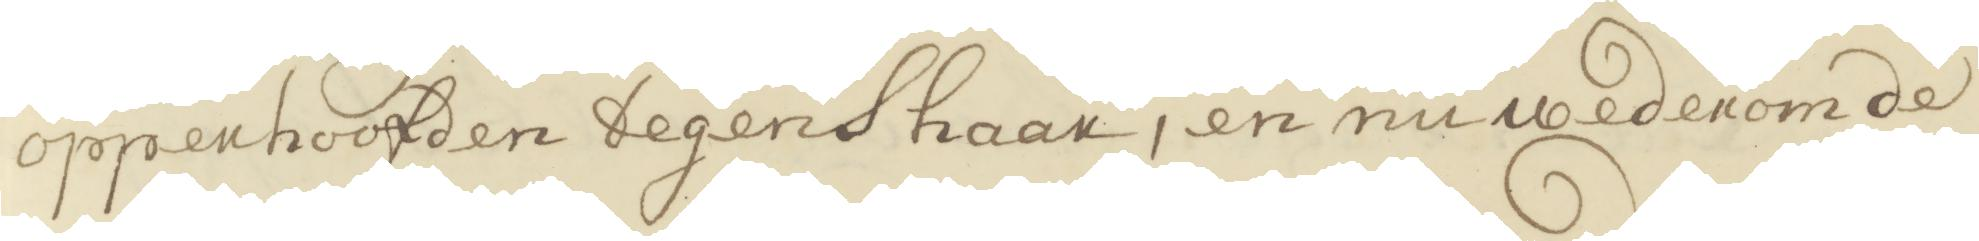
opperhoofden tegens haar, en nu wederom de
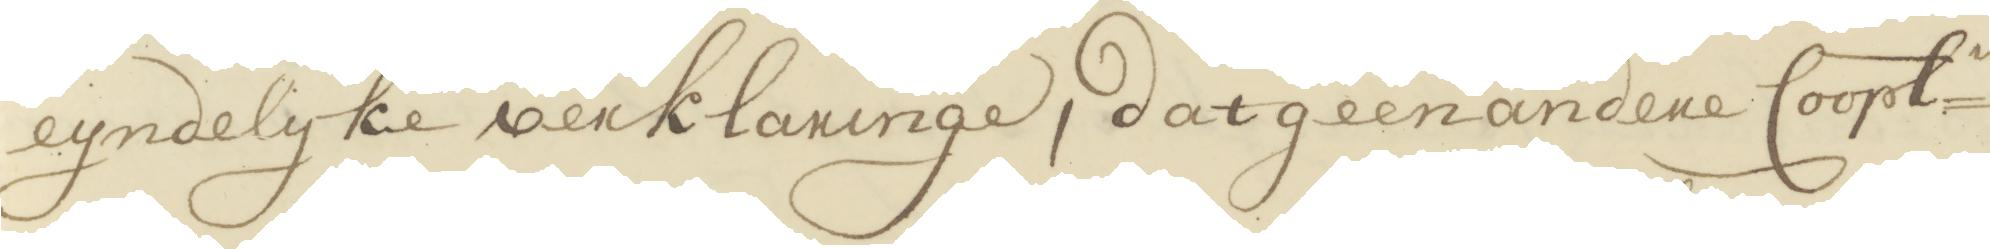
eyndelyke verklaringe, dat geen andere Coopl=n
